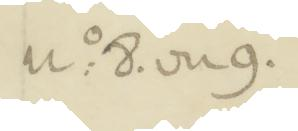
n:o 8. en9.
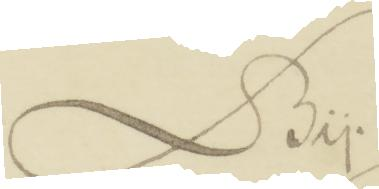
Bij.
